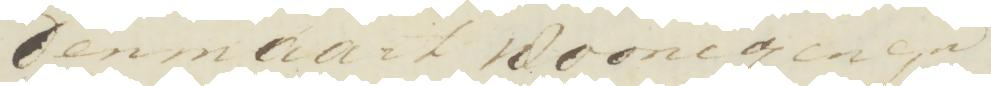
den maart hoonelen n
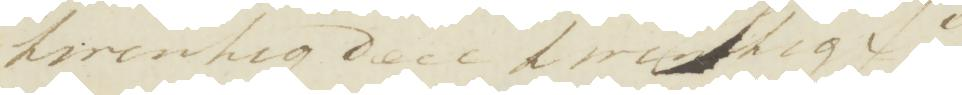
tiventig decltwintig
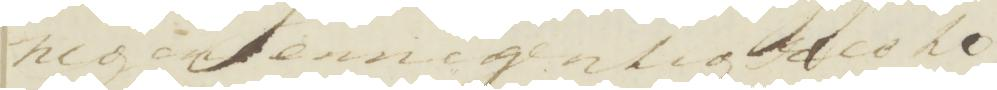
neg enennegentieddesho
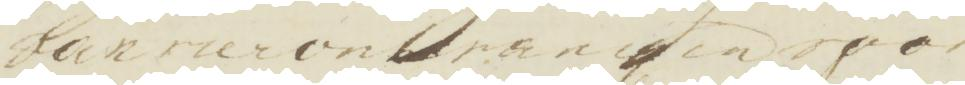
Jan vier ontvangen voor
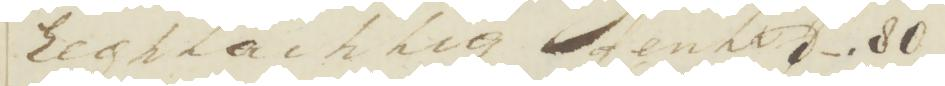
Eeghtackhig egenkt-.80
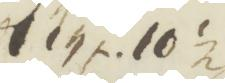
119ƒ.10½
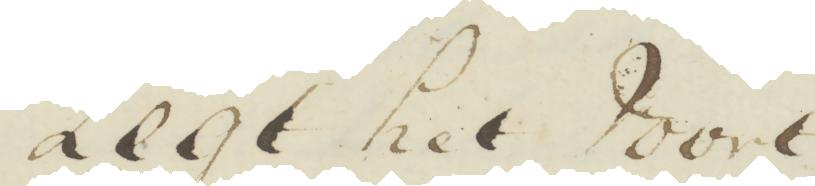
aegt het Voort
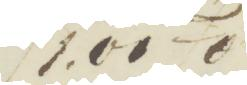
1.00d
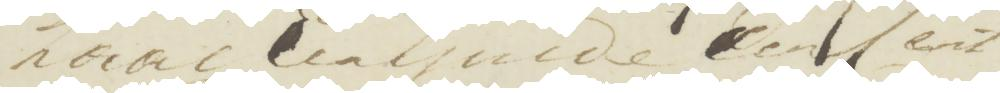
raal Een Gulde Eenen
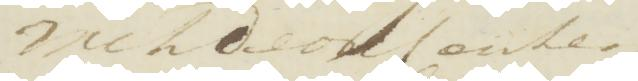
weh der Cente
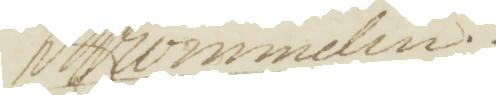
: Crommelin.
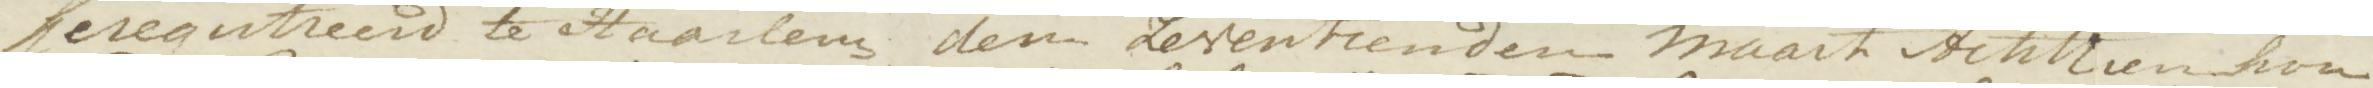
Geregistreerd te Haarlem den Zeventienden Maart Achttien hon
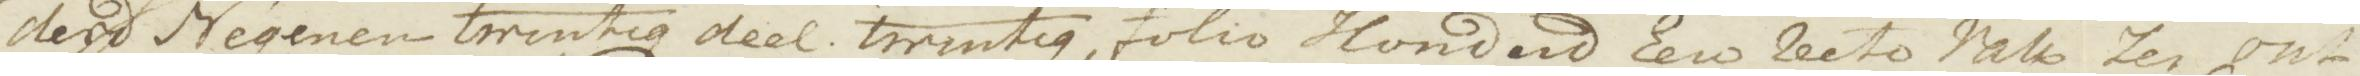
derd Negenen twintig deel. twintig, folio Honderd Een recte Vak Zes ont
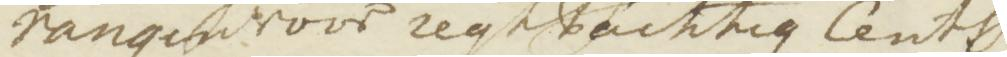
vangen voor regt Tachtig Cents
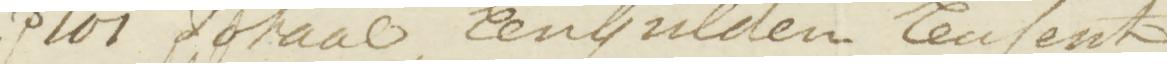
Een Gulden Een Cents
